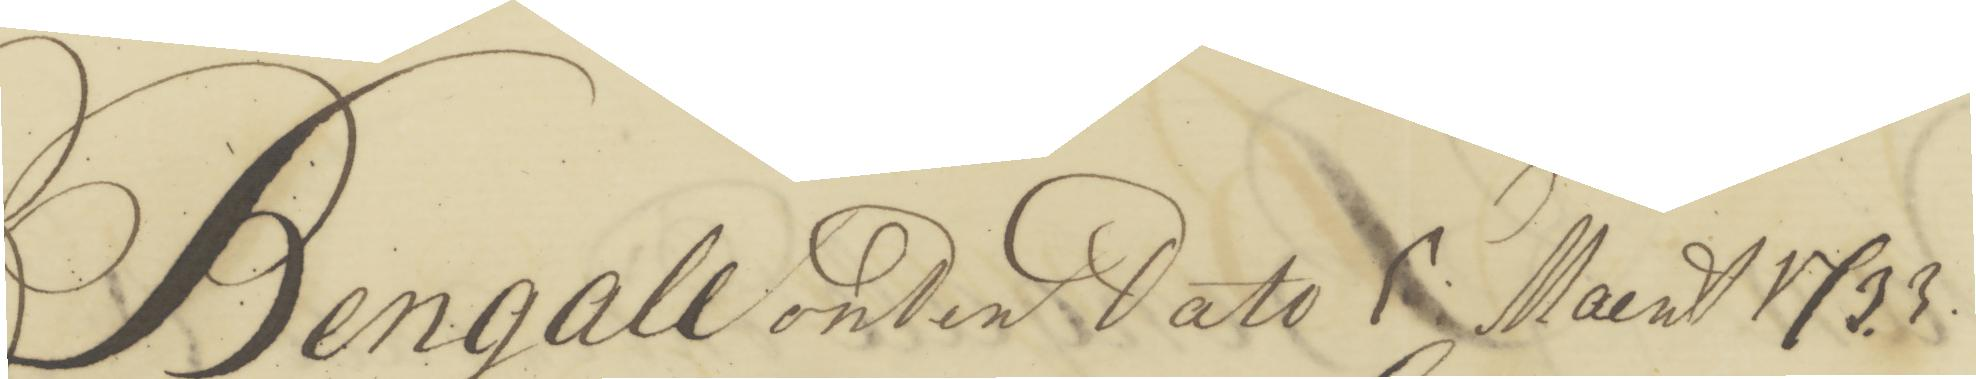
Van Bengale onder Dato 5' Maert 1733.
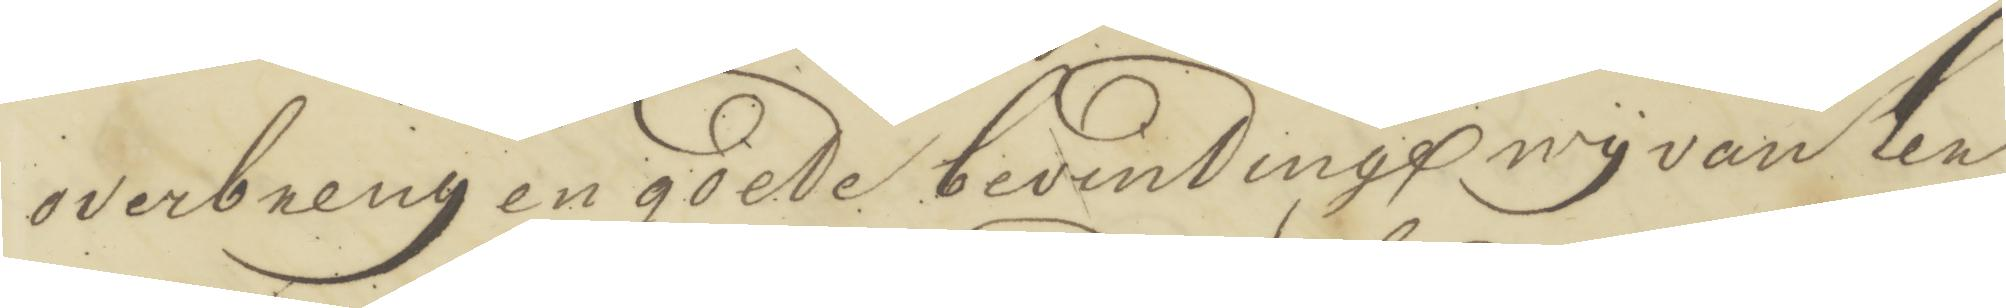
overbreng en goede bevindinge wij van her
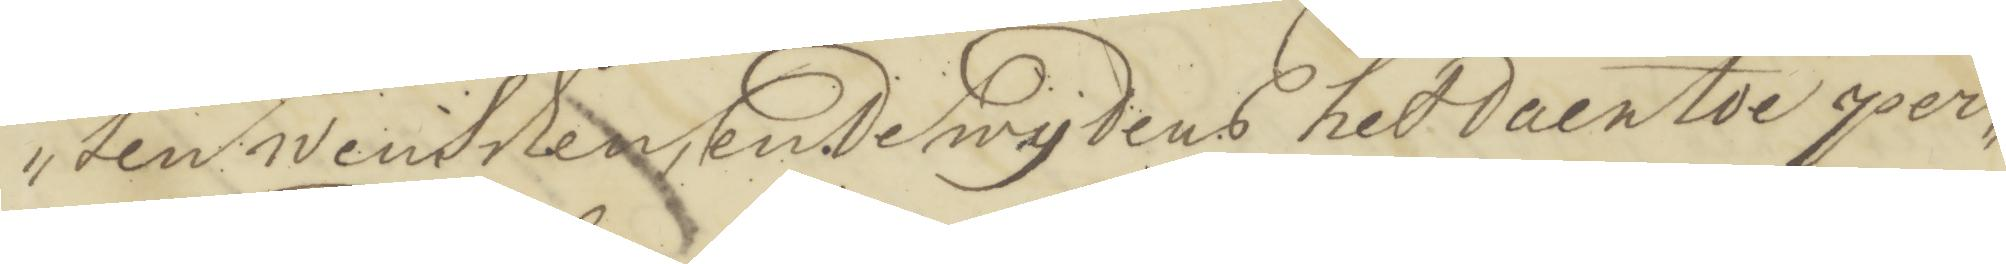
„ten wenschen, en de wijders het daer toe per„
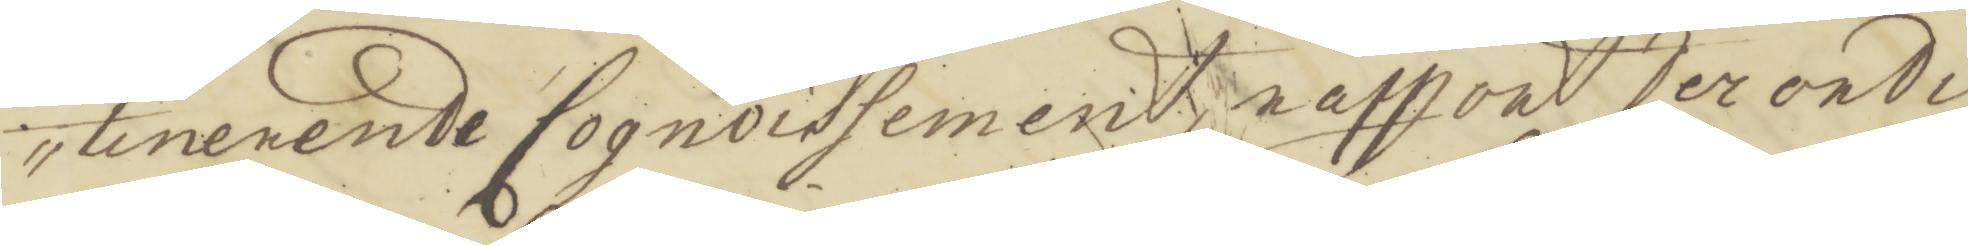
„tinerende Cognoissement, rapport der ordi
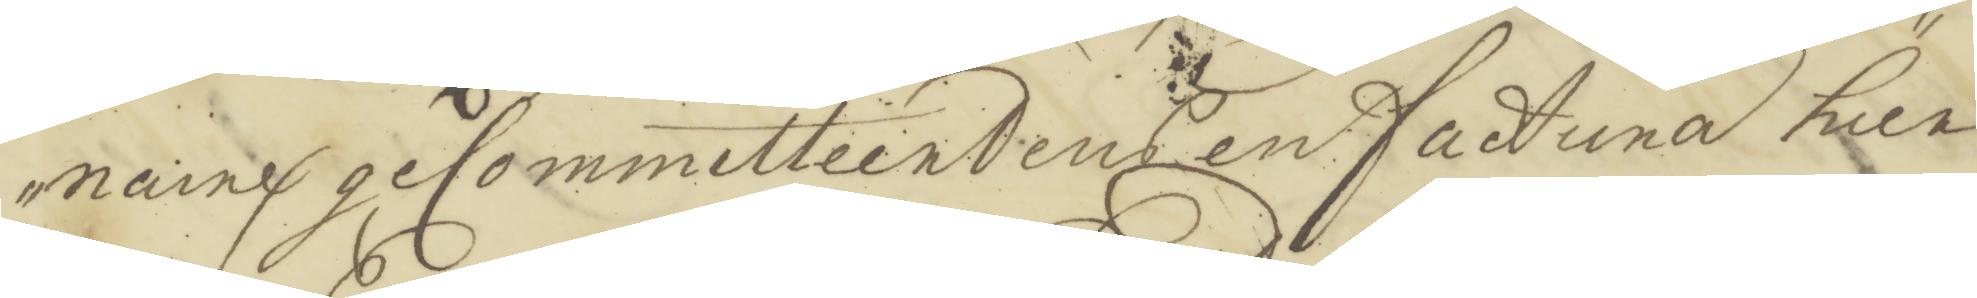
„naire gecommitteerdens en factura hier
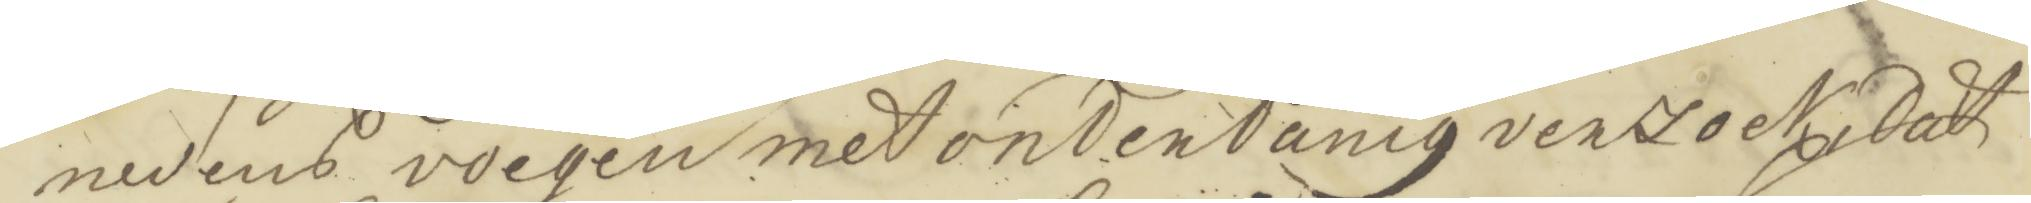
nevens voegen met onderdanig verzoek, dat
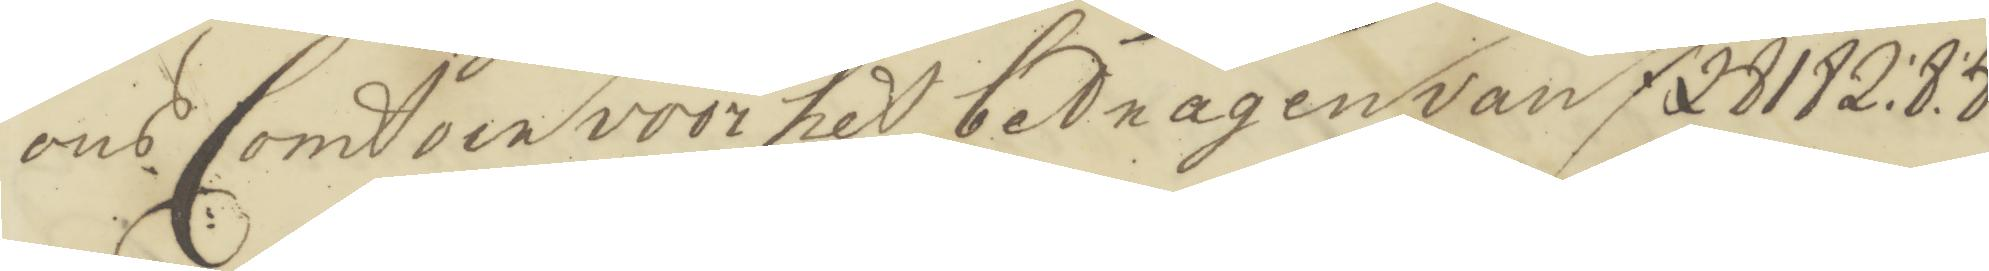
ons Comtoir voor het bedragen van ƒ 28182:8:8
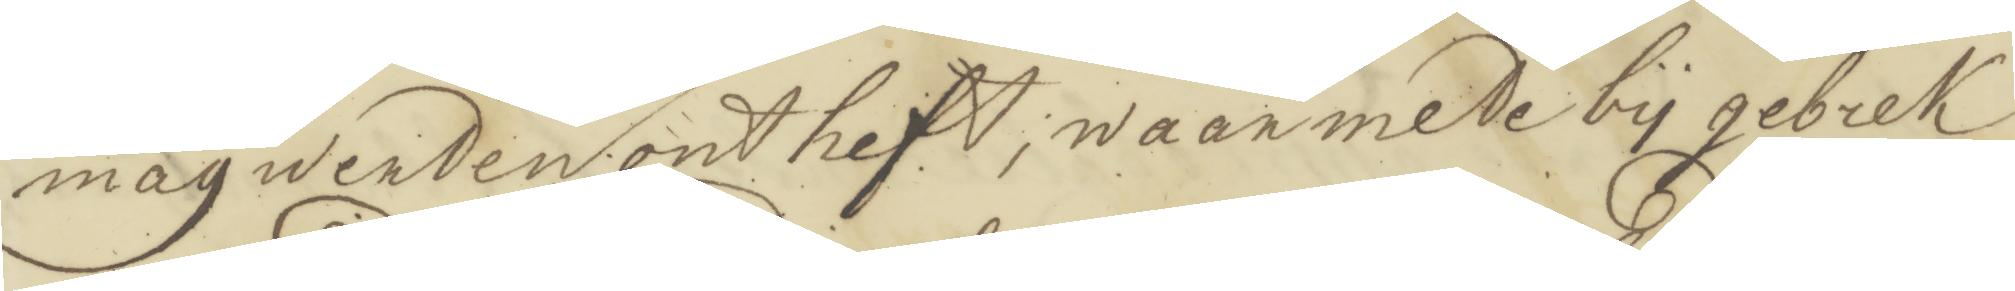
mag werden ontheft; waar mede bij gebrek
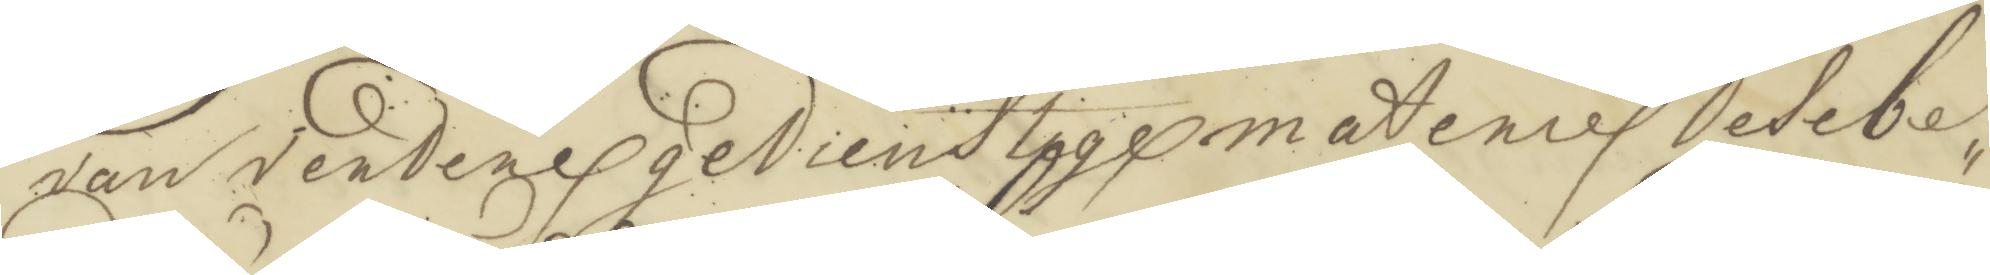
van verdere gedienstige materie dese be„
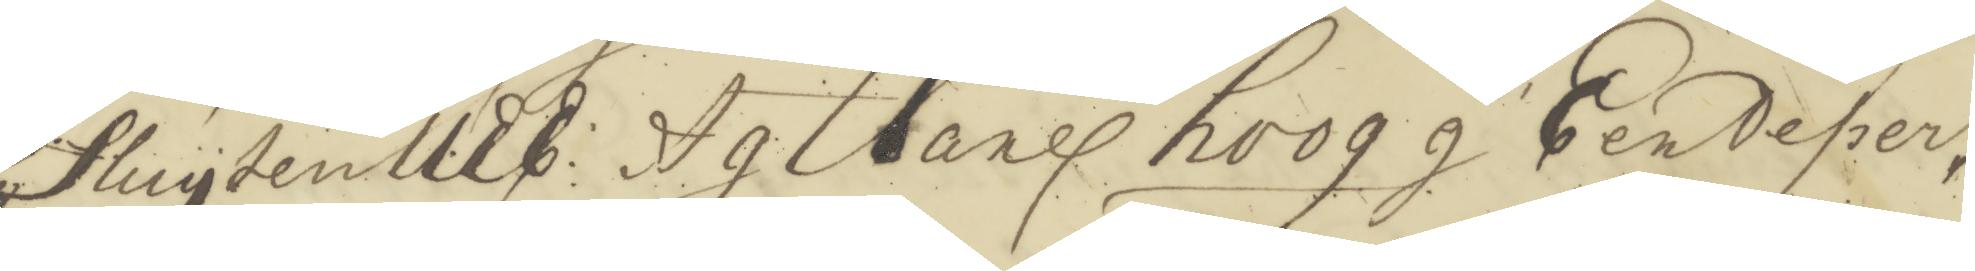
sluijten UEE: Agtbare hoog g’Eerde per„
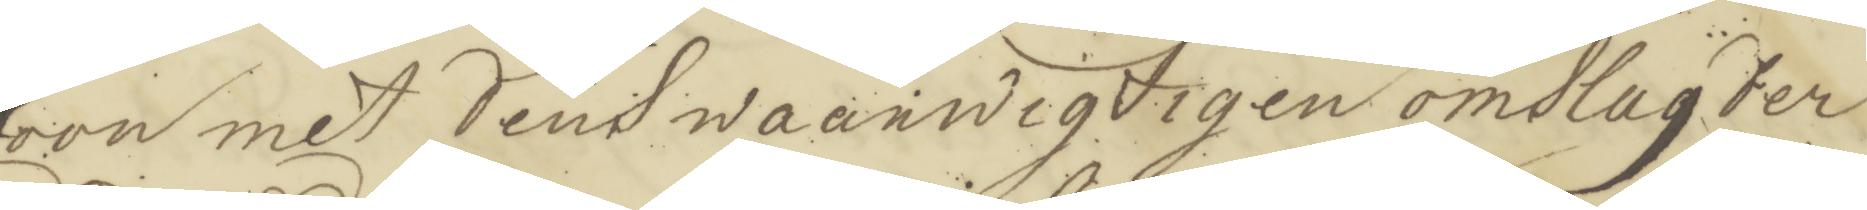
Soon met den Swaarwigtigen omslag der
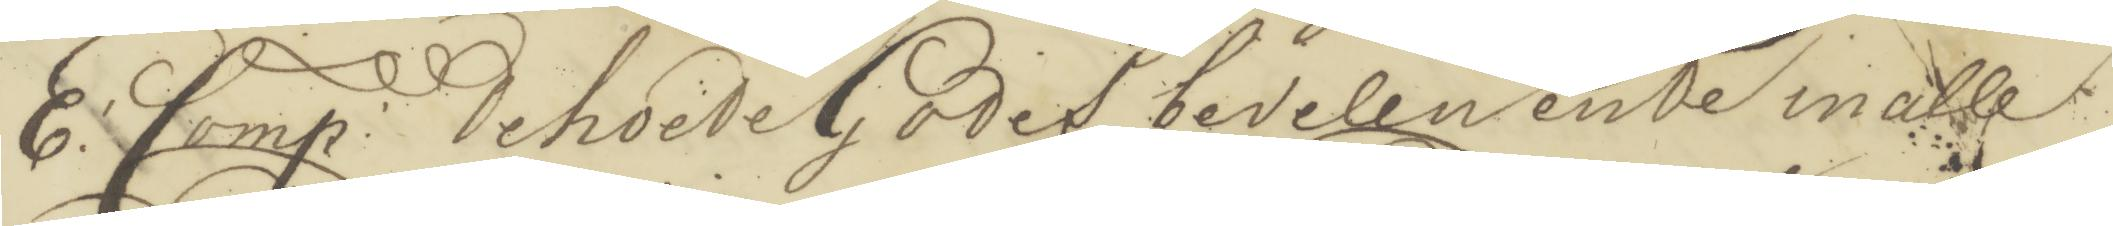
E: Comp:e de hoede Godes bevelen ende in alle
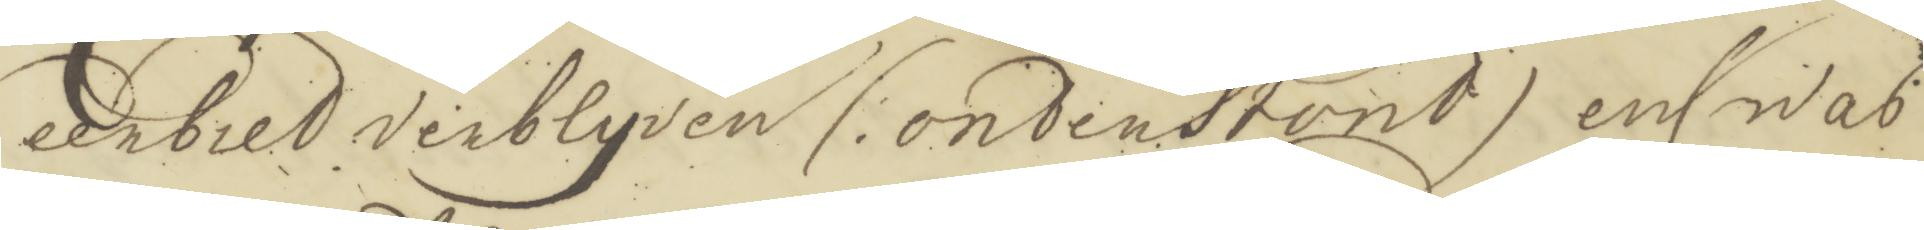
eerbied verblyven (:onderstond:) en (was
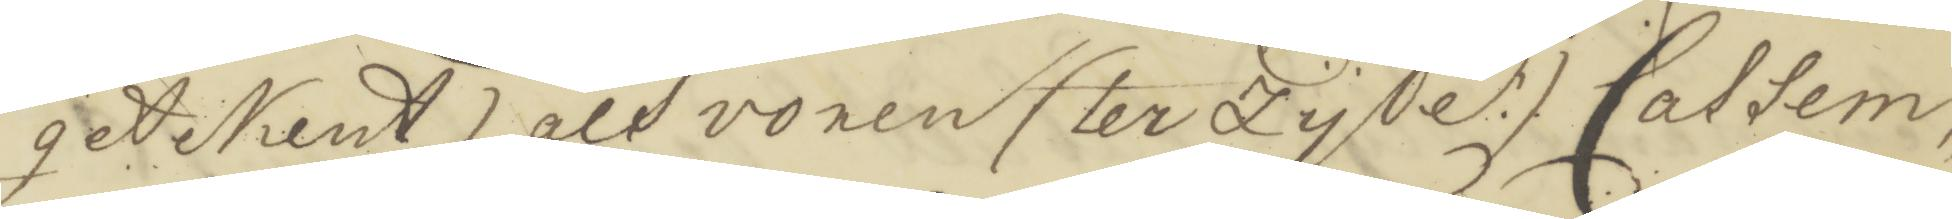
getekent) als voren (ter zijde:) Cassem,
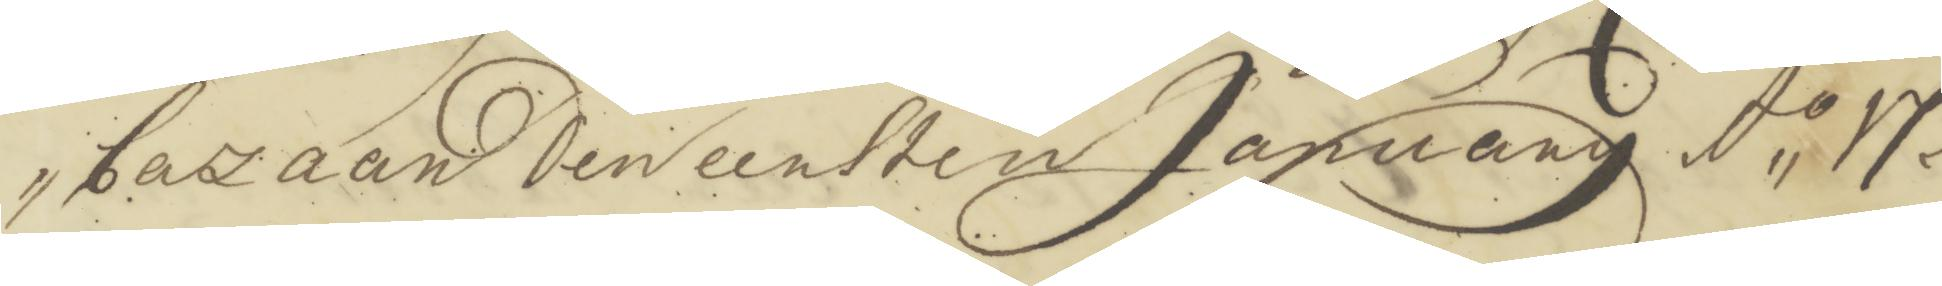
„bazaar den eersten Januarij A„o 1733
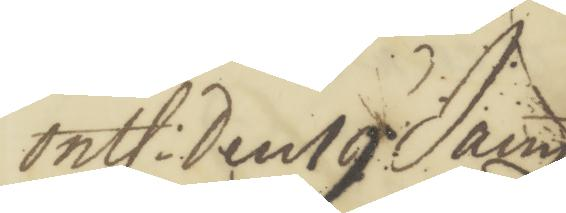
ontf: den 19:e Iann
